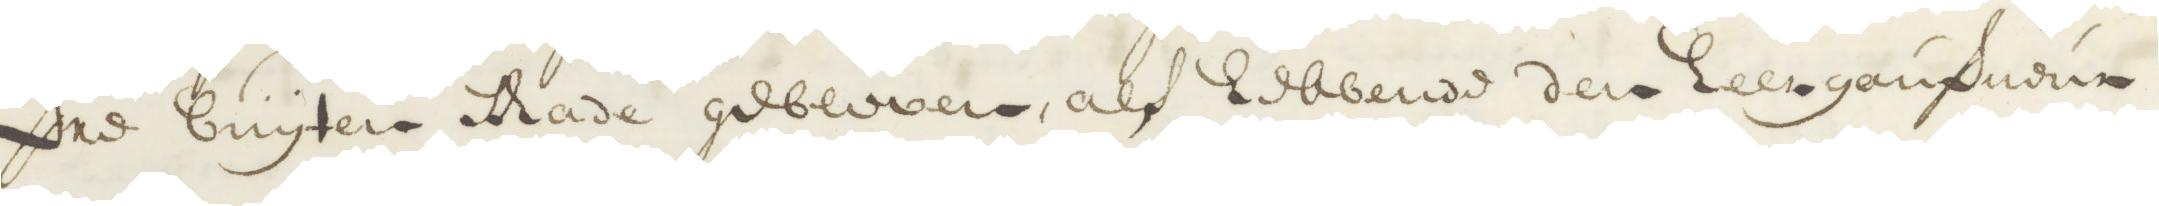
verre buijten schade gebleven, als hebbende den heer gouverneur
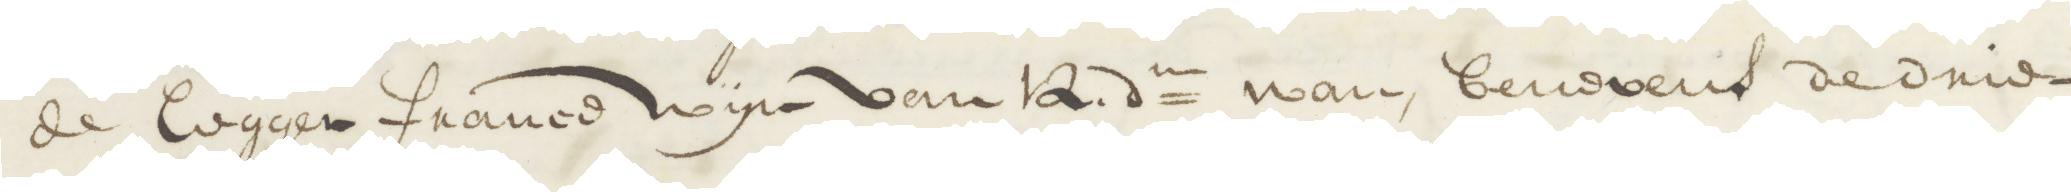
de legger france wijn van 12. d=m wan, benevens de drie
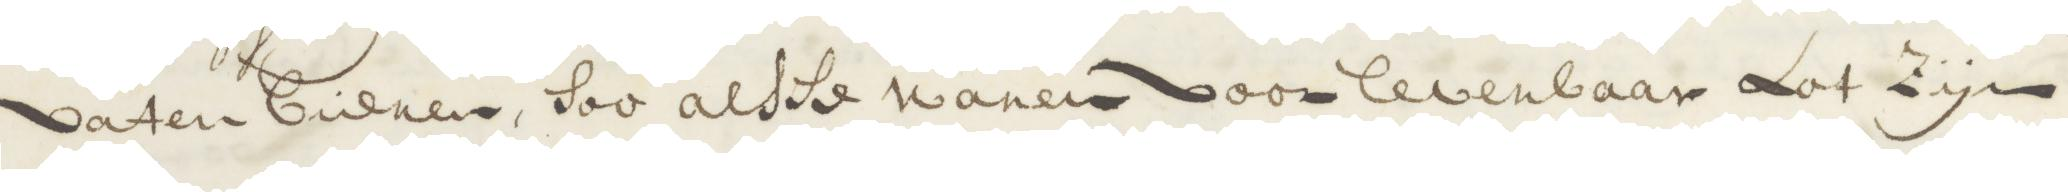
vaten bieren, soo alsse waren voor leverbaar tot zijn
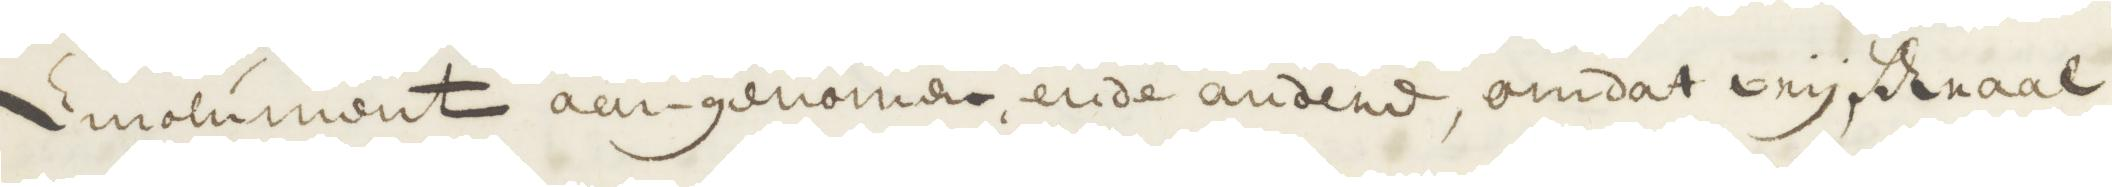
Emolument aen genomen, ende andere, om dat vrij, schraal
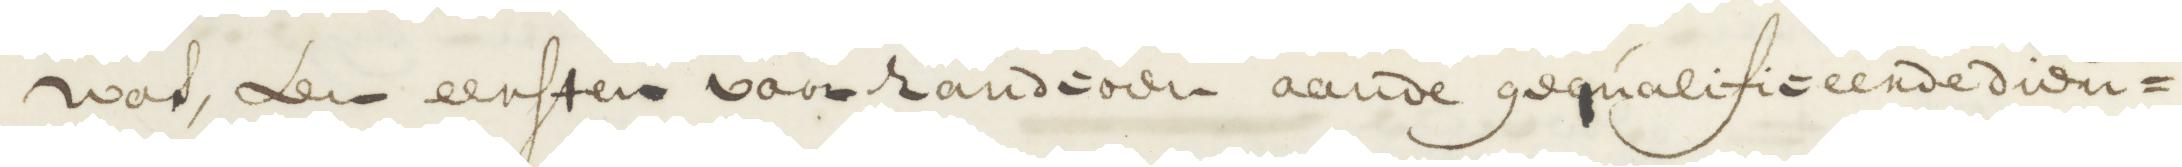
was, ten eersten voor randcoen aande gequalificeerde dien=drs
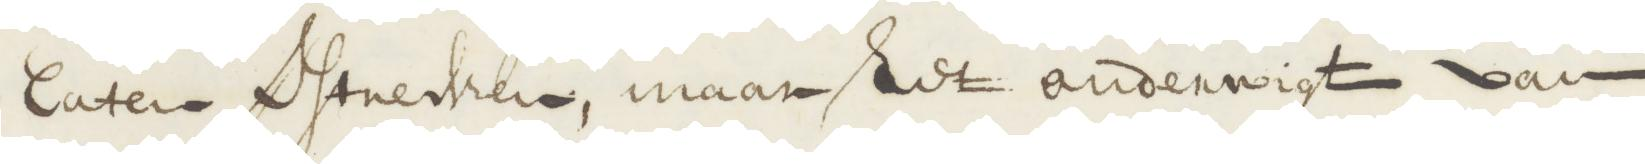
laten verstrecken, maar het onderwigt van
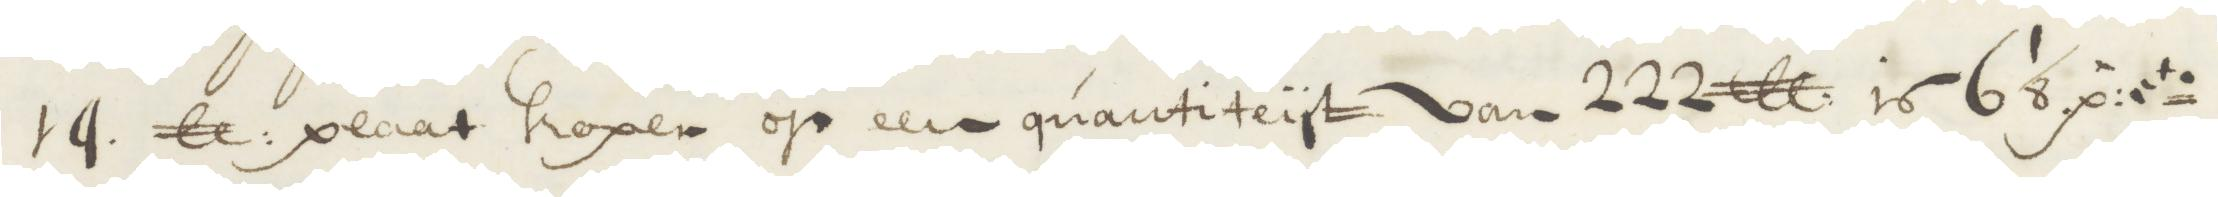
14. lb: plaat koper op een quantiteijt van 222 lb: is 6 1/8. p:r c=to
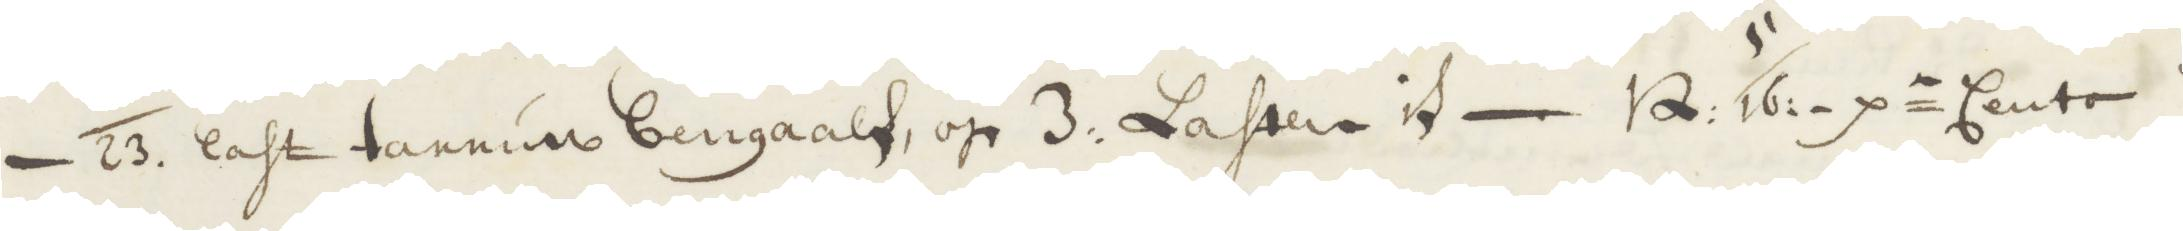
— 17/23. last tarruw bengaals, op 3: Lasten is — 12:5/16:-.p=r cento
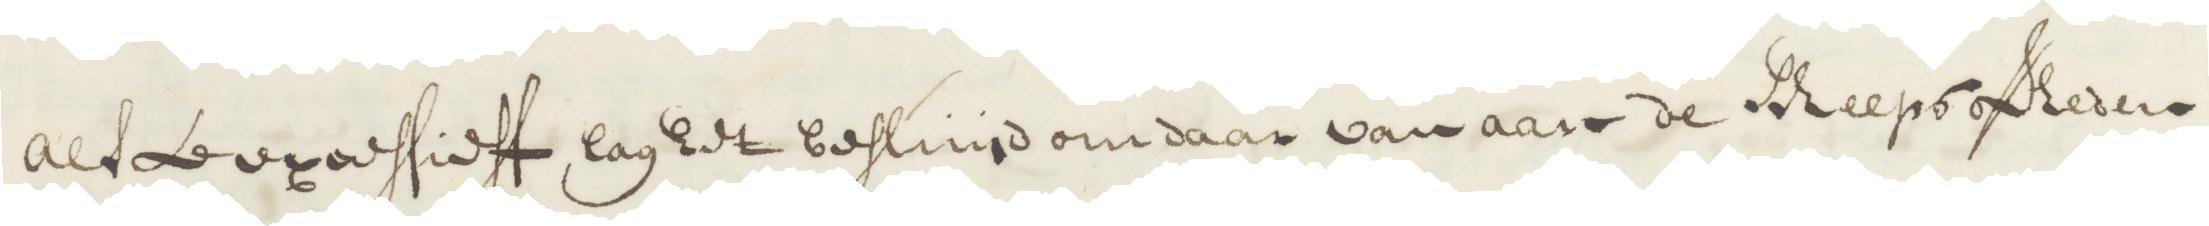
als te excessieff lag het besluijd om daar van aan de scheepsoverheden
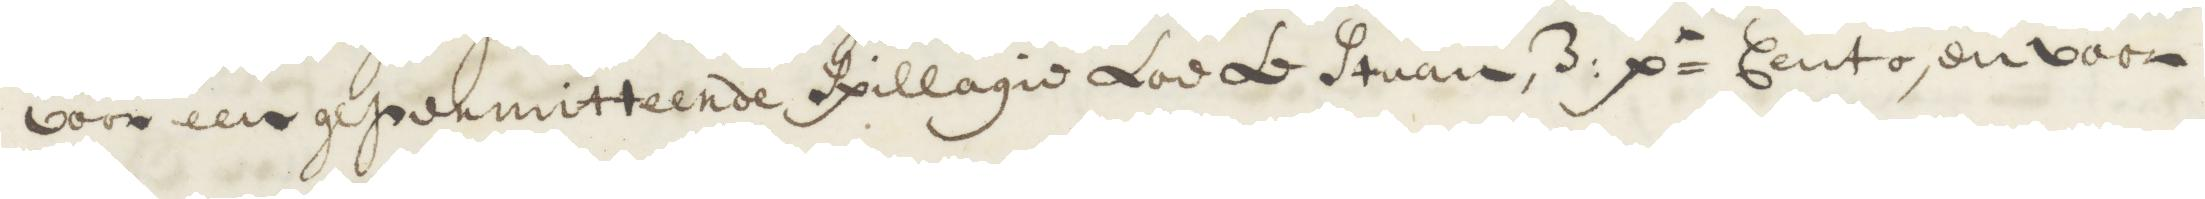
voor een gepermitteerde spillagie toe te staan, 3: p=r cento, en voor
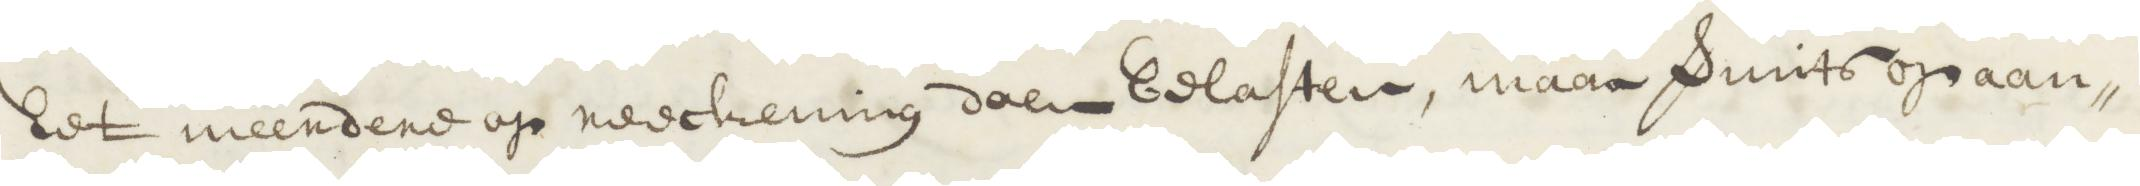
het meerdere op reeckening doen belasten, maar vermits op aan„
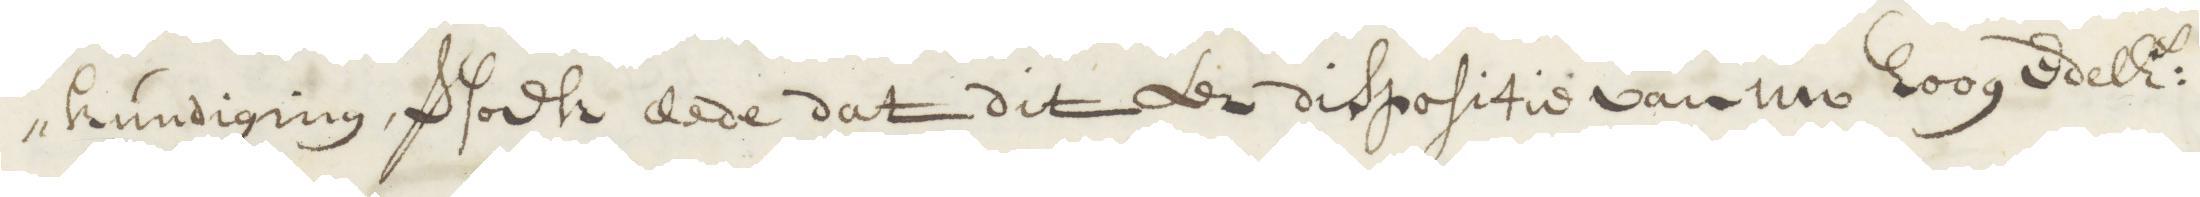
„kundiging, versoek dede dat dit ter dispositie van uw hoog Edelh:s
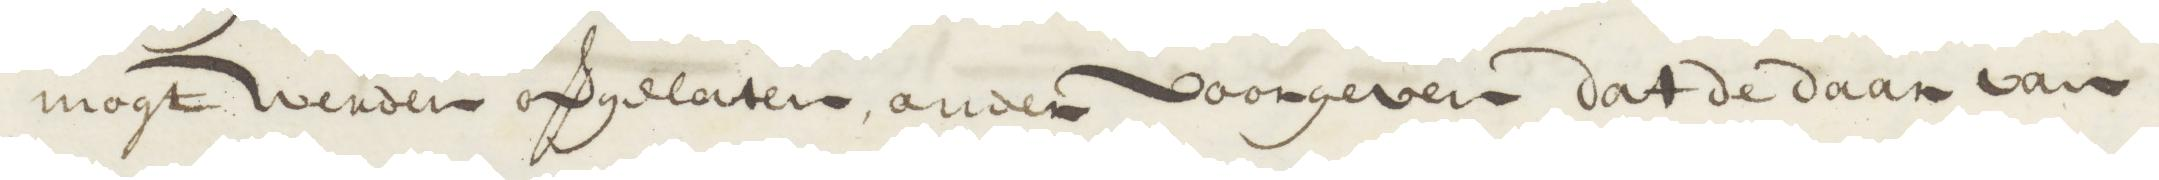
mogt werden overgelaten, onder voorgeven dat de daar van
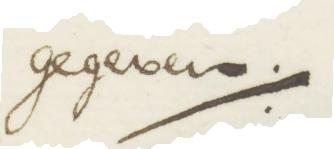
gegeven /:
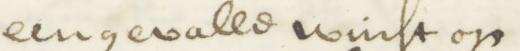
een gevalle winst op
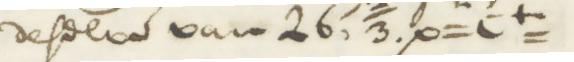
deselve van 26:' 2/3. p=r c=t
